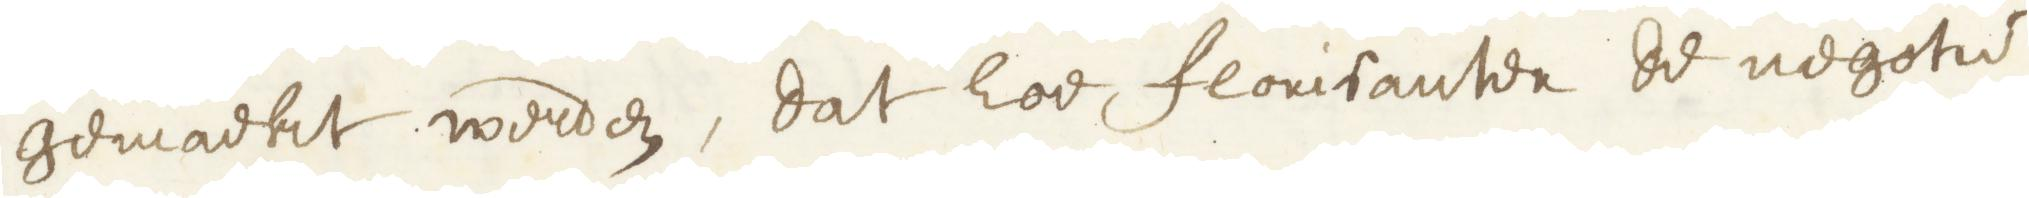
gemaekt werden, dat hoe florisanter de negotie
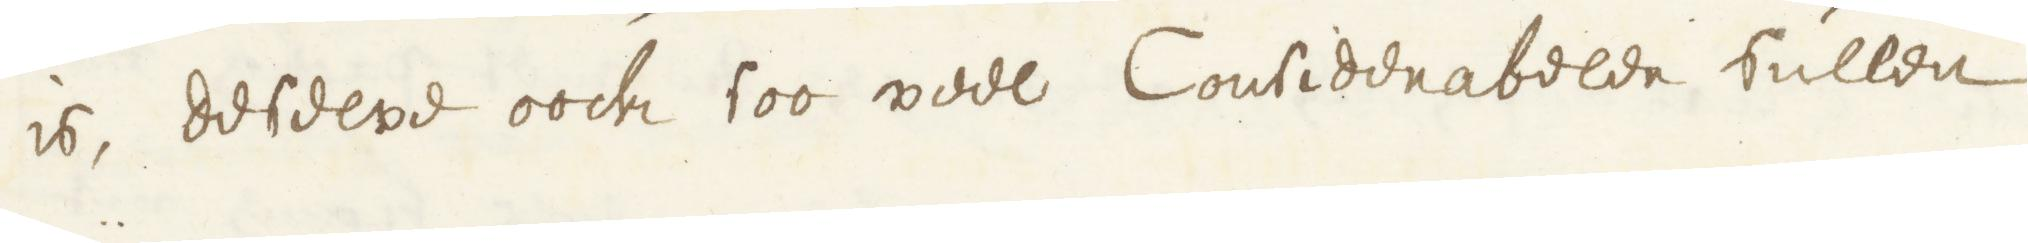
is, deselve oock soo veel Considerabeler sullen
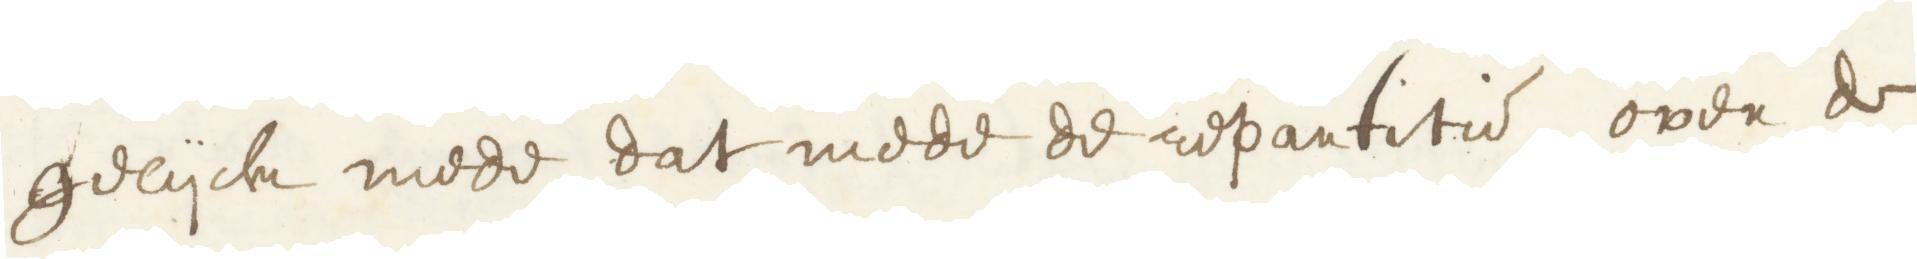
gelijck mede dat mede de repartitie over de
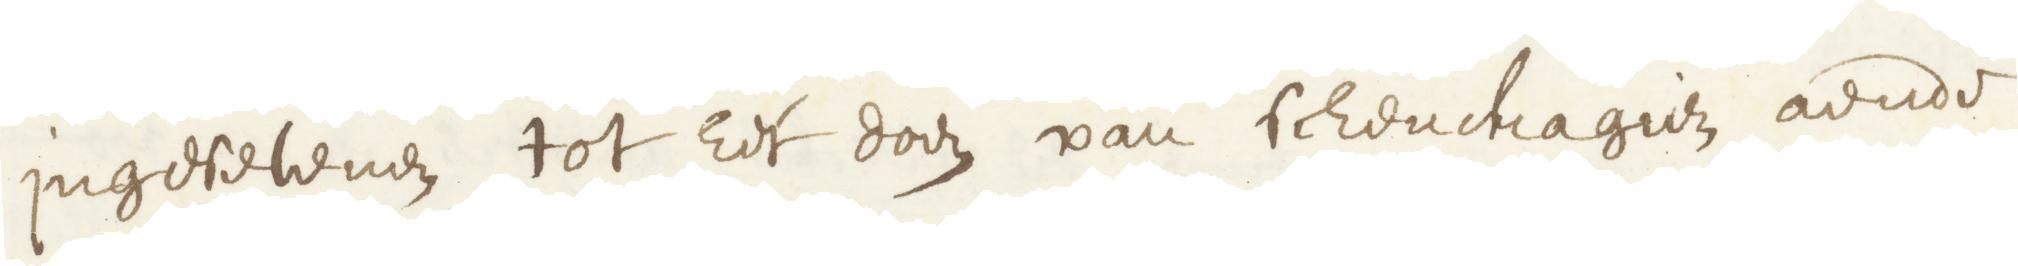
ingesetenen tot het doen van schenckagien aende
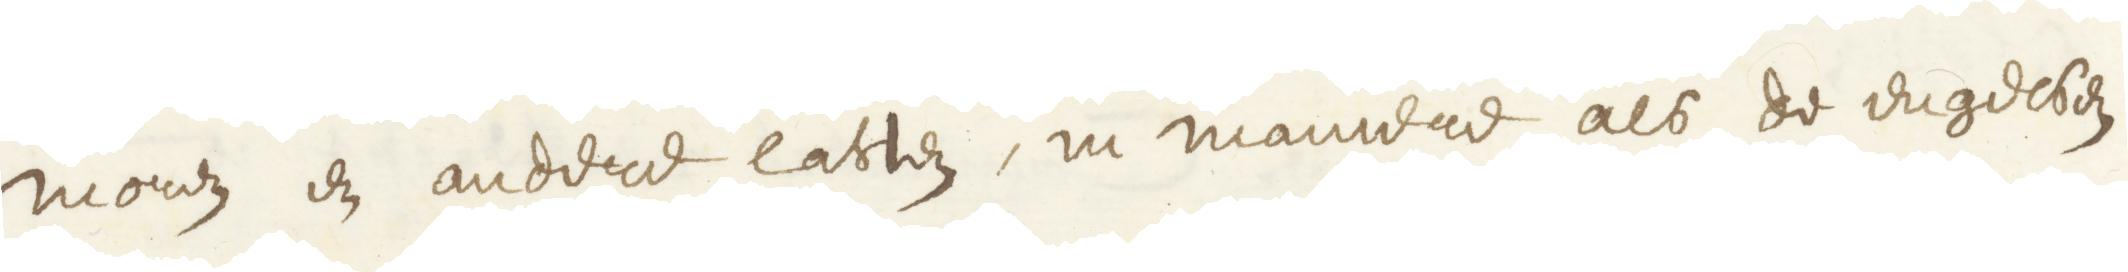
moren en andere lasten, in maniere als de engelsen
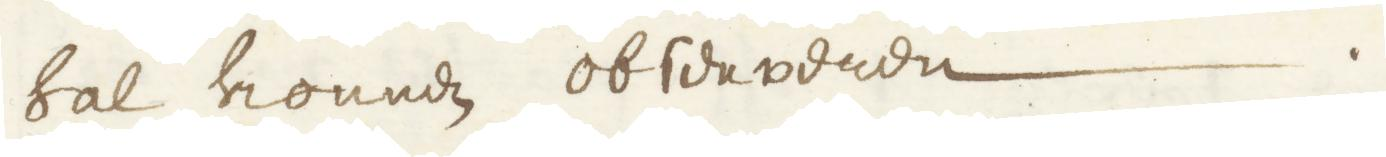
sal konnen observeren.
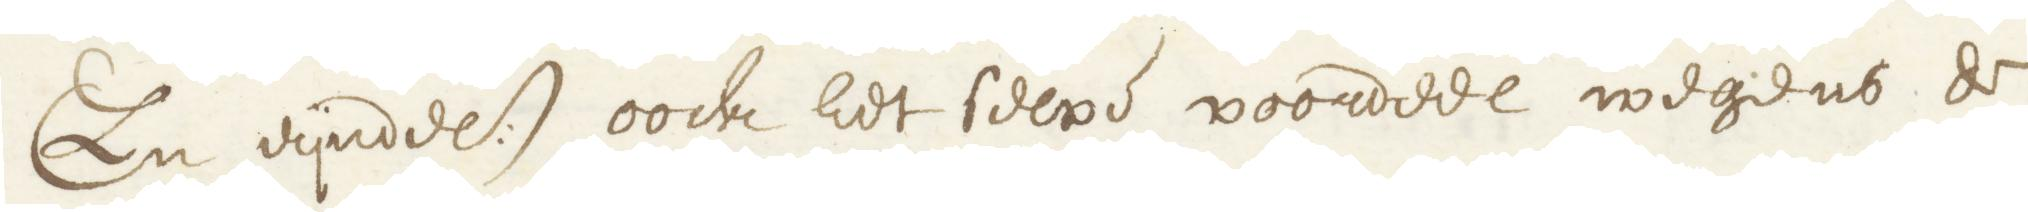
En eijndelijk oock het selve voordeel wegens de
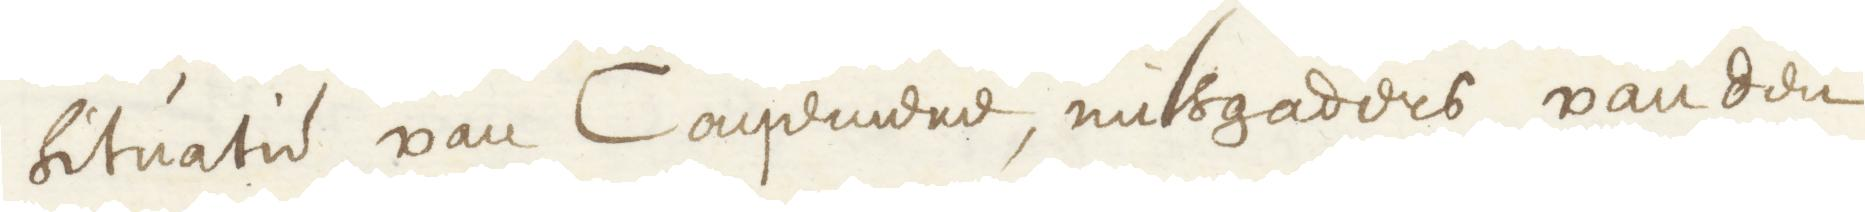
situatie van Caijemere, mitsgaders van den
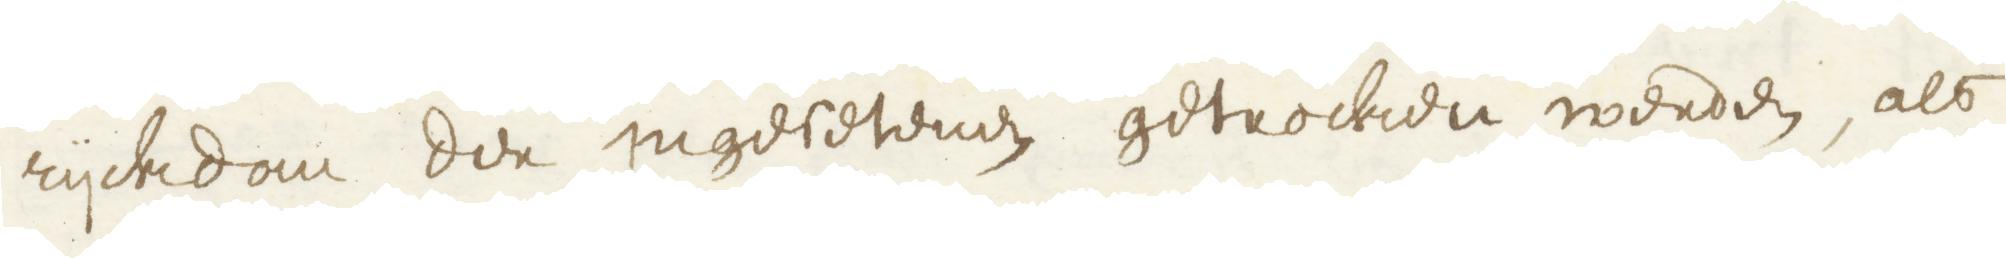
rijckdom der ingesetenen getrocken werden, als
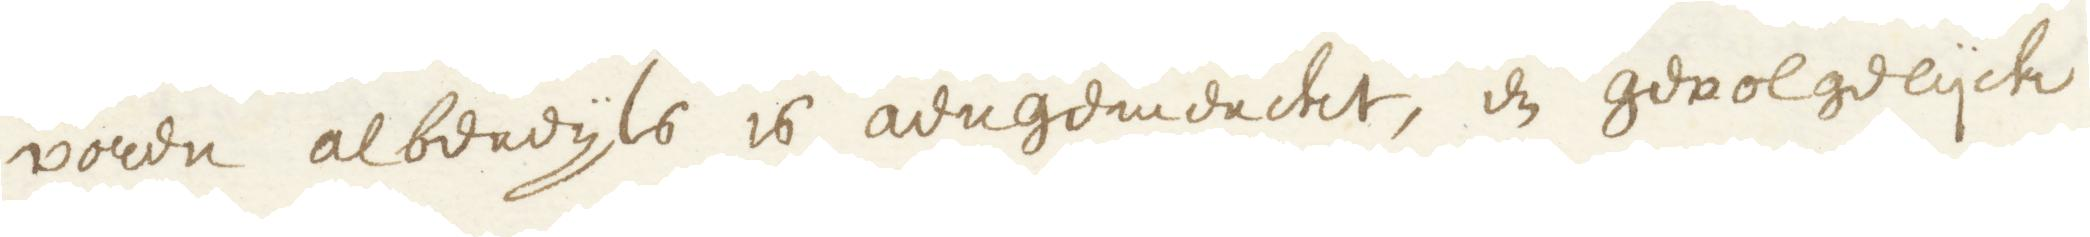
voren albereijts is aengemerckt, en gevolgelijck
